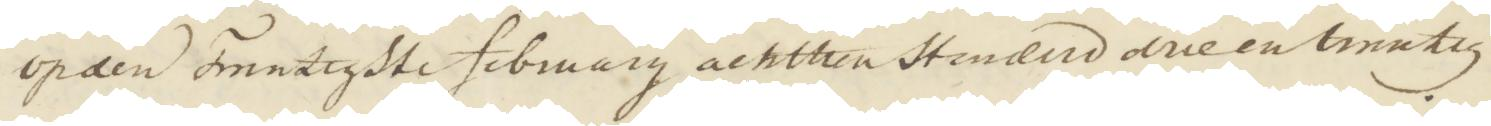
op den Twintigste February achttien Honderd drie en twintig
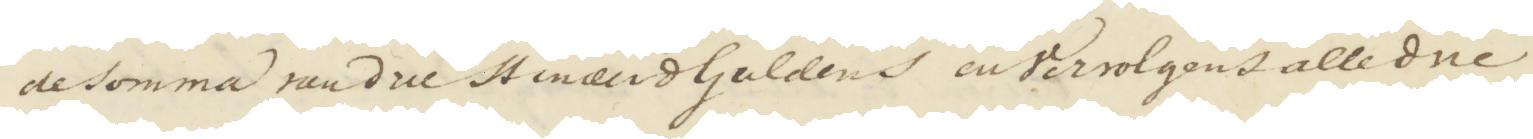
de somma van drie Honderd Guldens en Vervolgens alle drie
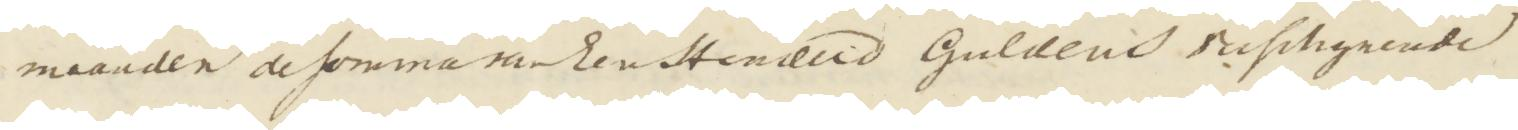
maanden de somma van Een Honderd guldens verschynende
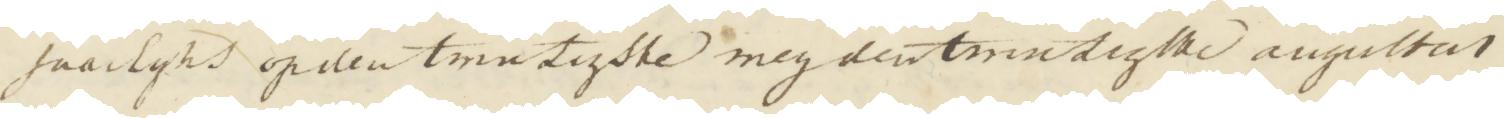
Jaarlyks op den twintigste mey den twintigste augustus
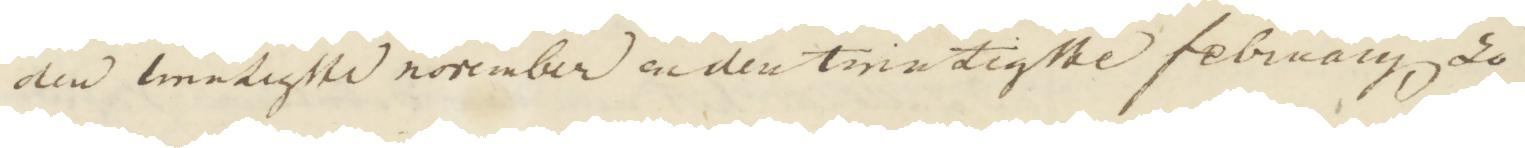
den twintigste november en den twintigste february zo
